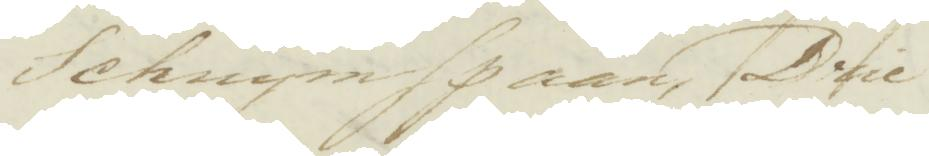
Schuymspaan, Drie
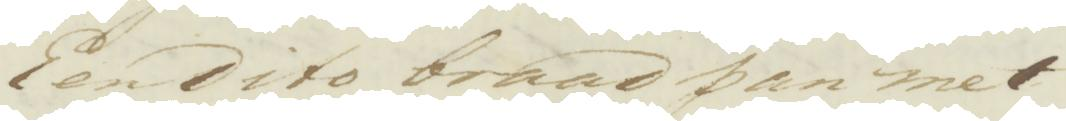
Een dito braad pan met
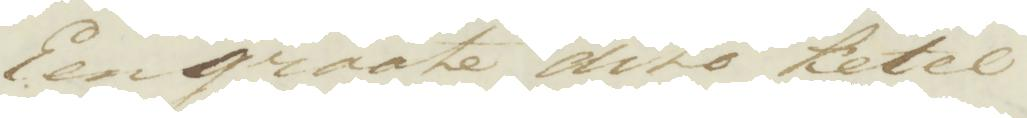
Een groote dito ketel
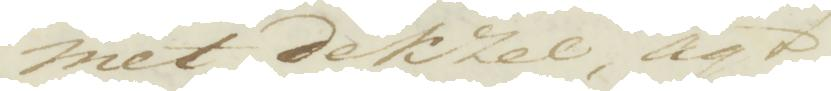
met dekzel, agt
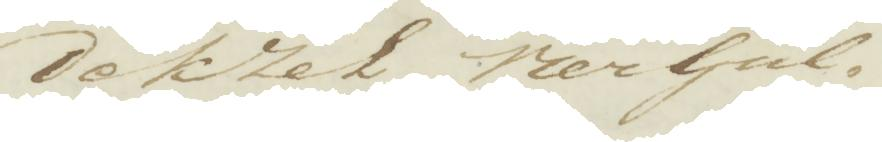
dekzel, vier Gul„
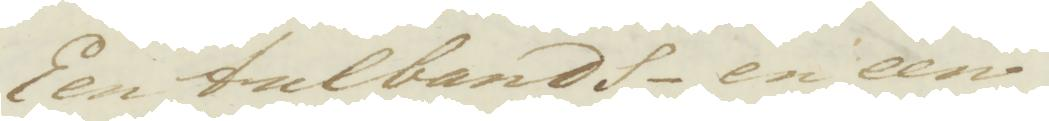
Een tulbands- en een
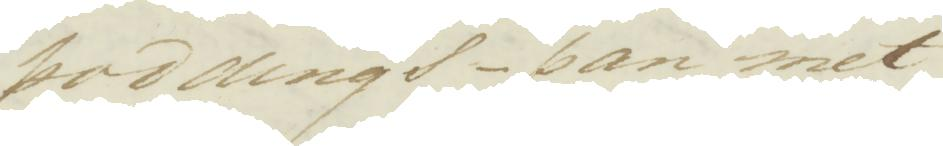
poddings-pan met
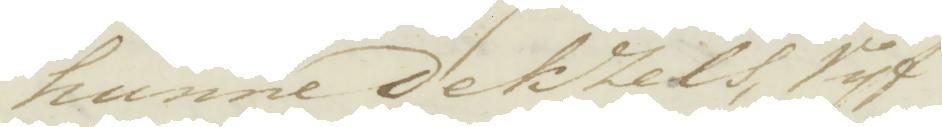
hunne Dekzels, Vyf
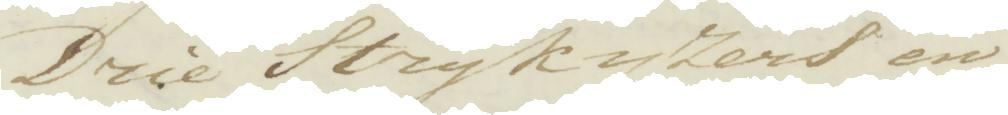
Drie strykyzers en
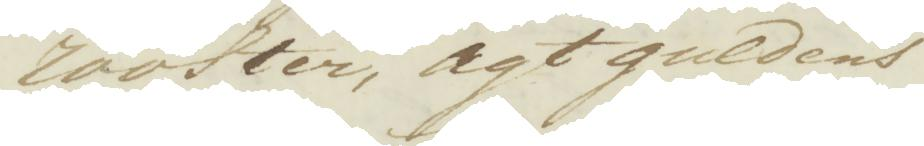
rooster, agt guldens
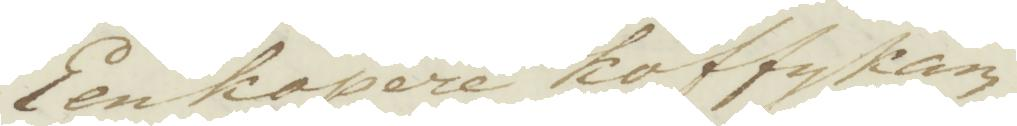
Een kopere koffykan
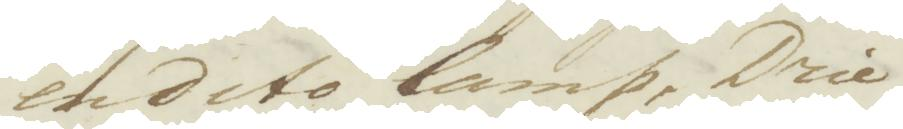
en dito lamp, Drie
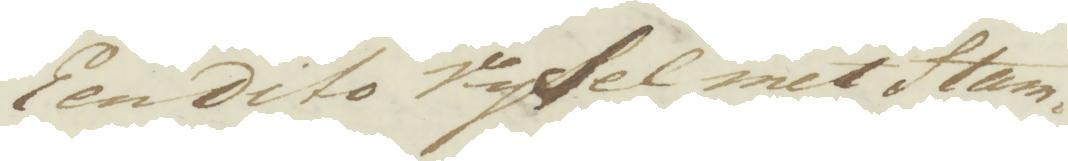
Een dito Vysel met stam„
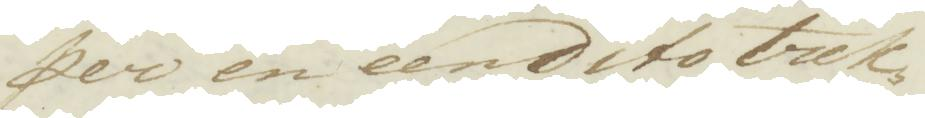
per en een dito trek„
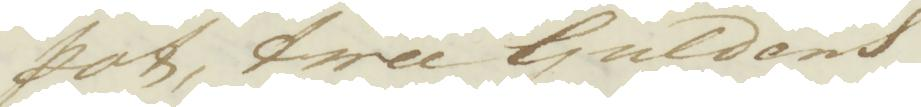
pot, twee Guldens
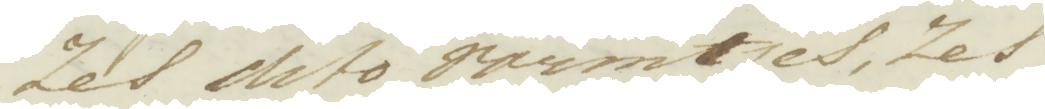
zes dito vormtjes, Zes
